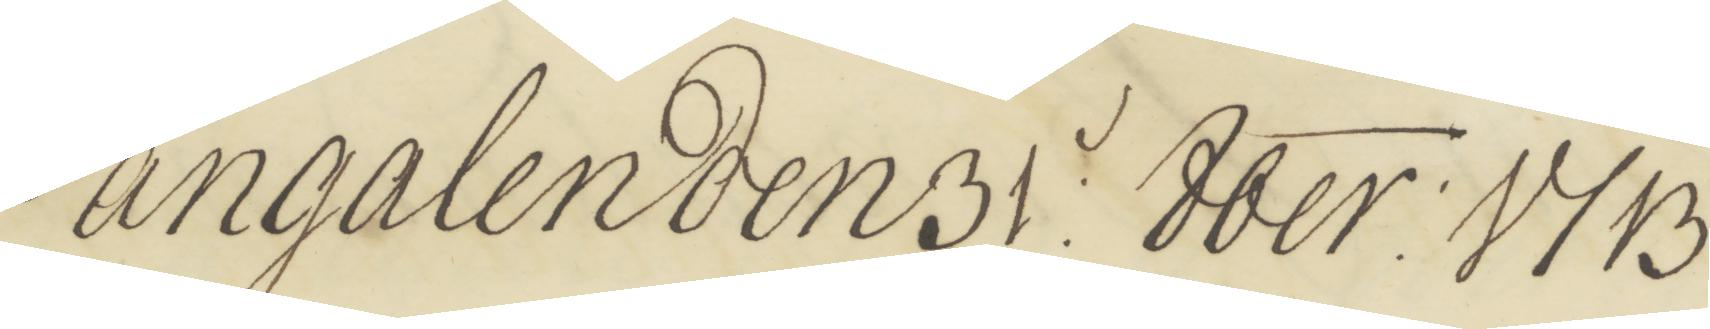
Van Bangalen den 31:' 8ber: 1713
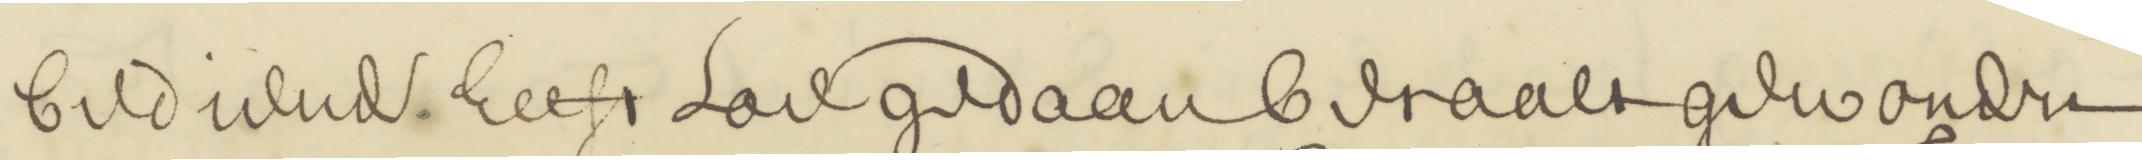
bediende heeft toe gedaan betaalt geworden
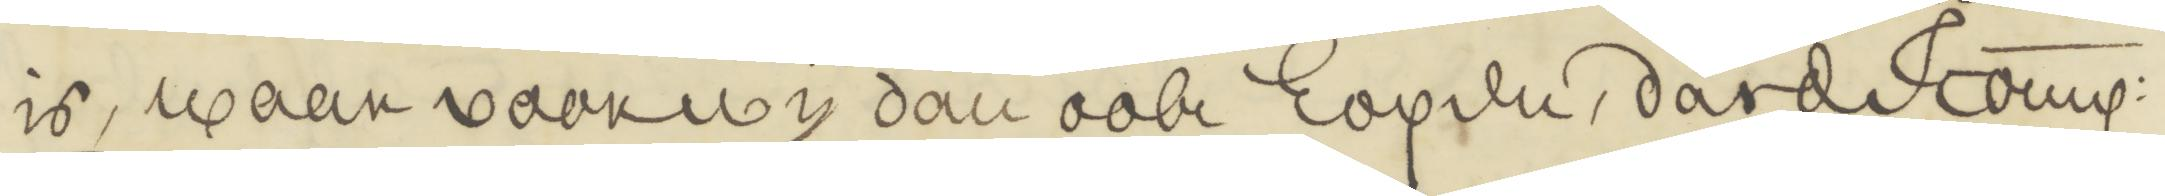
is, waar voor wij dan ook hopen, dat dEcomp:
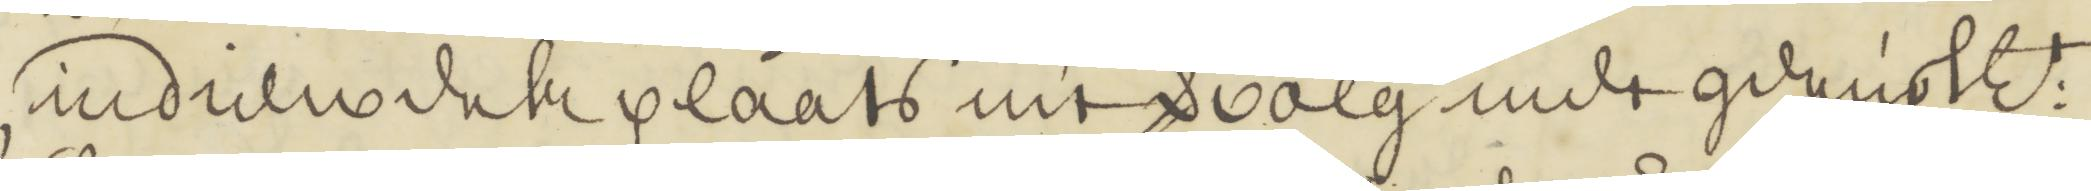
in die werk plaats in’t vervolg met gerusth:t
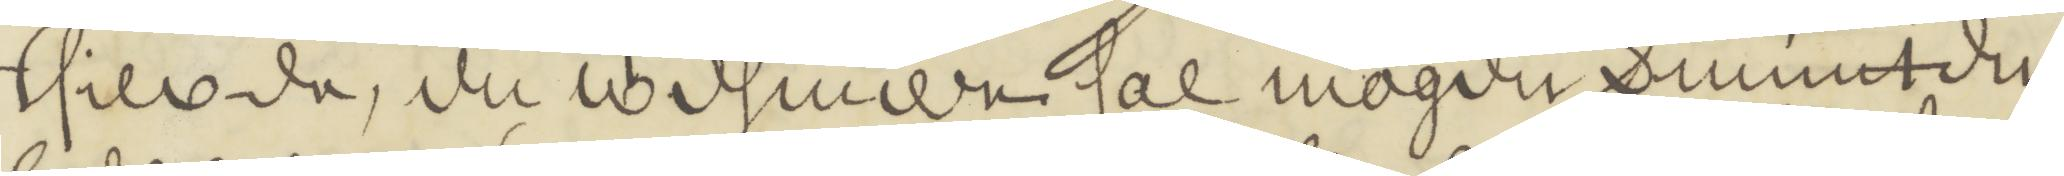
'tsilver, en wesmeer sal mogen vermunten
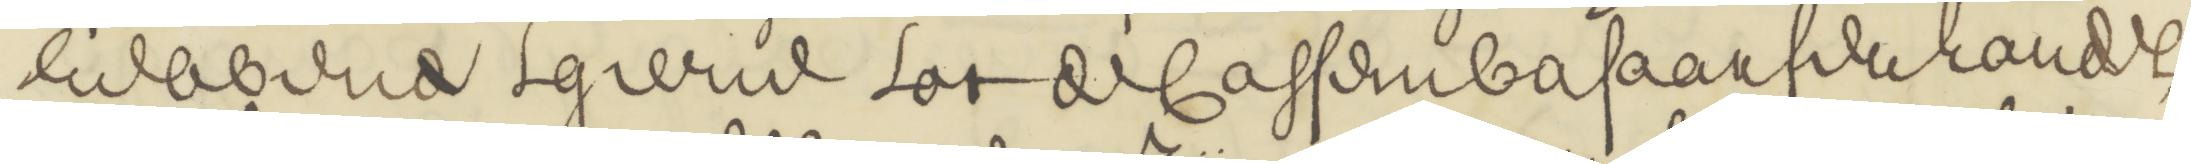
hebbende 'tgeene tot de Cassembasaarsen handel
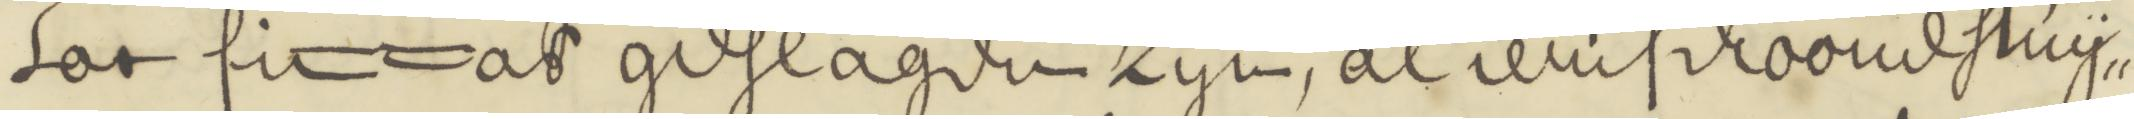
tot siccas geslagen zijn, al een schoone stuij„
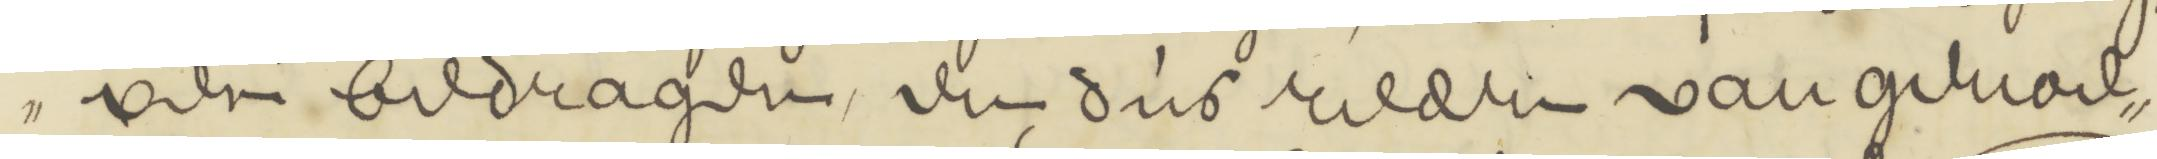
„ver bedragen, en dus reden van genoe„
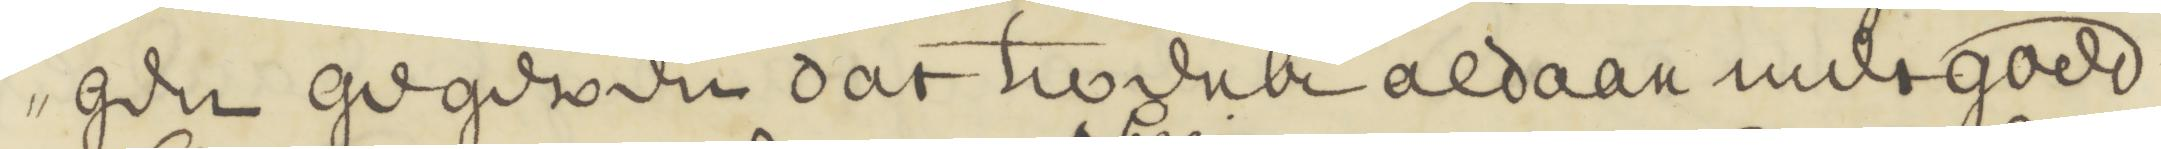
„gen gegeven dat twerk aldaar met goed
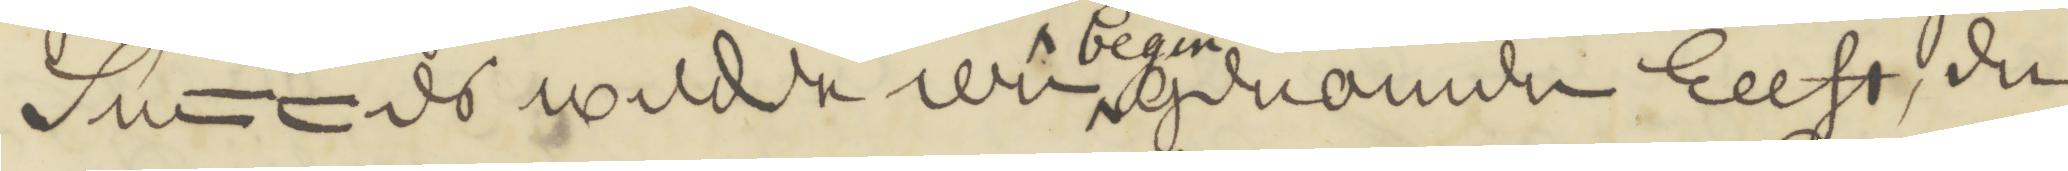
succes weder een ^ genomen heeft, en
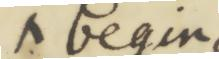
^ begin
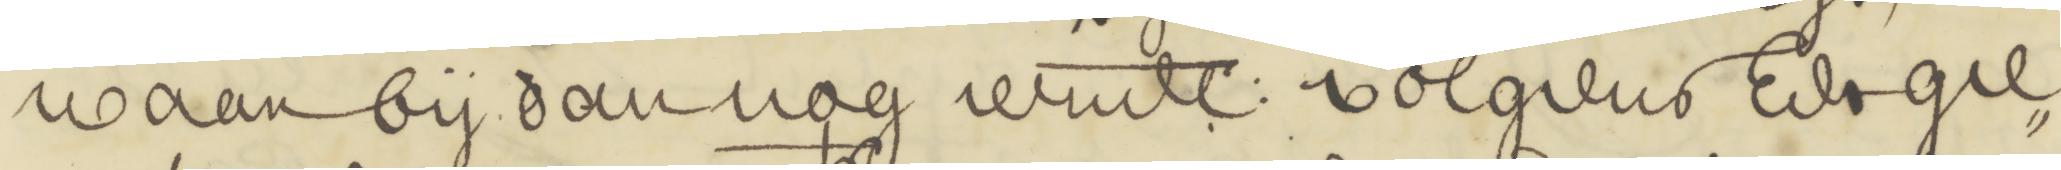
waarbij dan nog eenelijk volgens het ge„
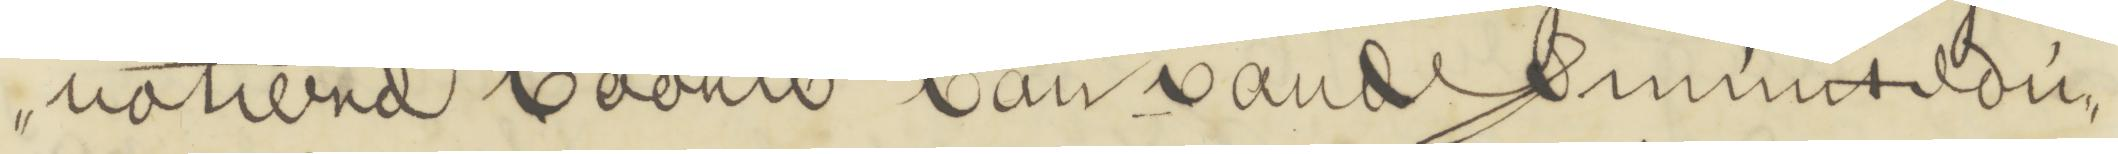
„noteerd voorwts van vande vermunte du„
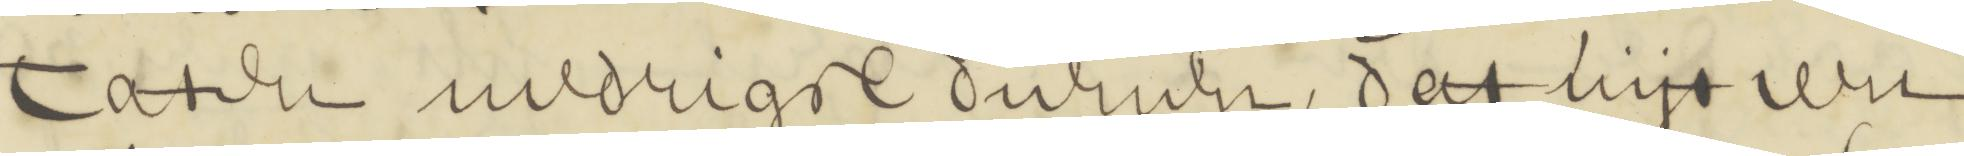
caten nedrigst dienen, dat uijt een
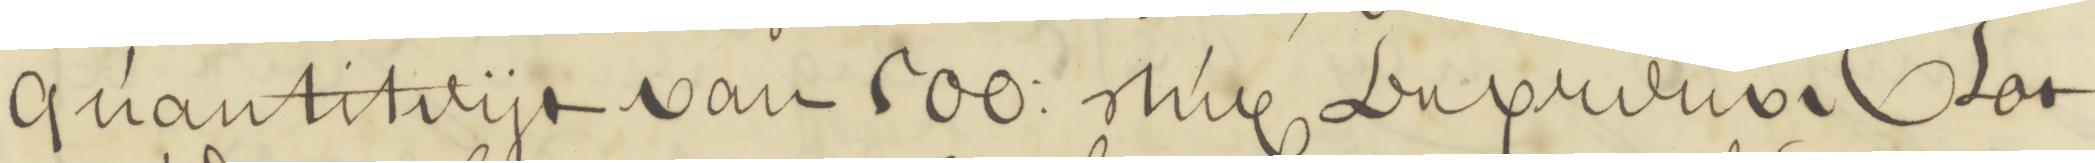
quantiteijt van 500: stux ter preuve tot
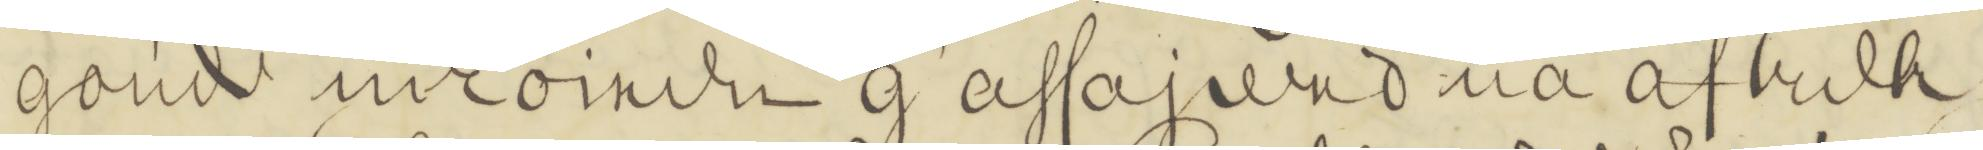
goude inhoiren g’assajeerd na aftrek
